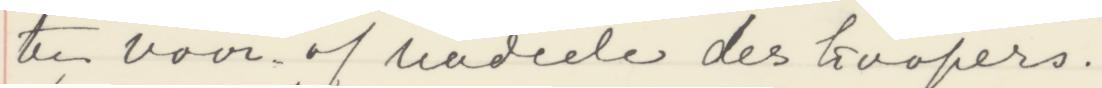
ten voor of nadeele des koopers.
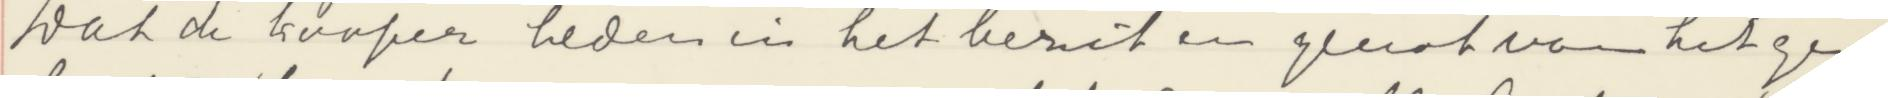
Dat de kooper heden in het bezit en genot van het ge-
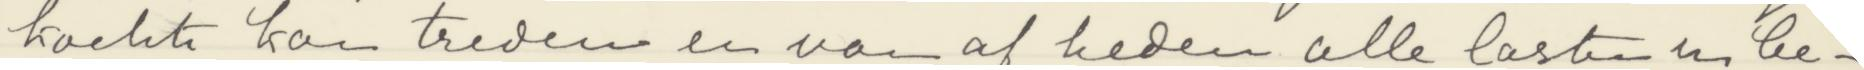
kochte kan treden en van af heden alle lasten en be-
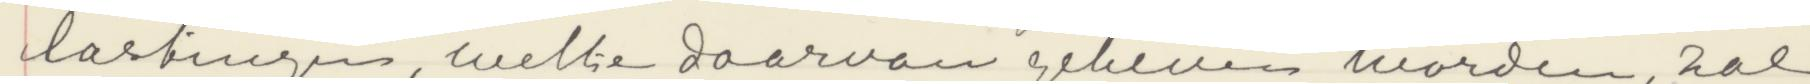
lastingen, welke daarvan geheven worden, zal
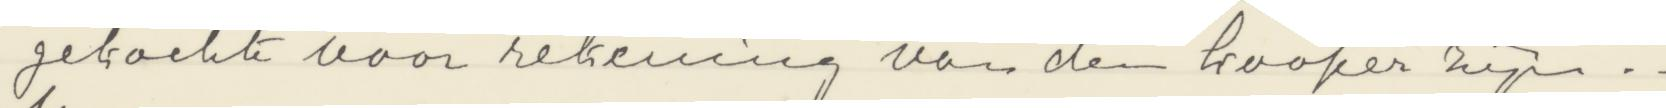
gekochte voor rekening van den kooper zijn.
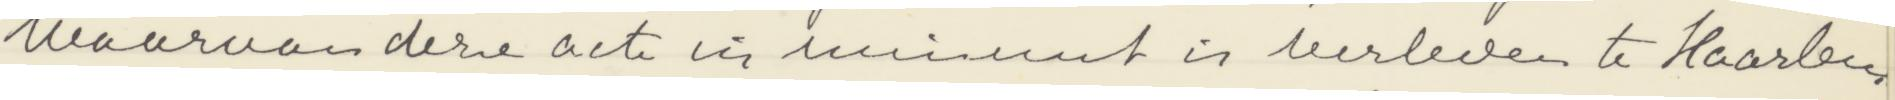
waarvan deze acte in minuut is verleden te Haarlem
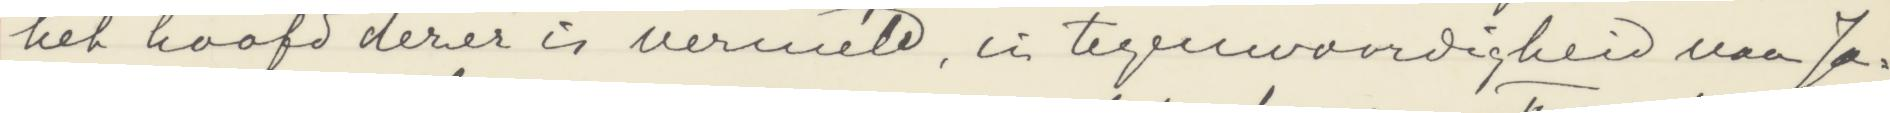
het hoofd dezer is vermeld, in tegenwoordigheid van Ja
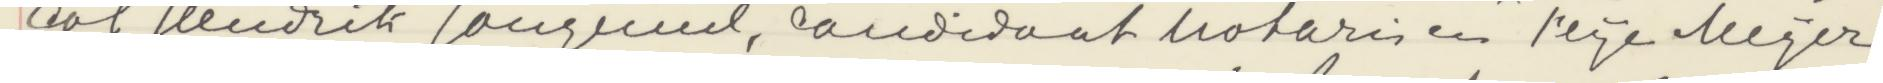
cob Hendrik Jongeneel, candidaat notaris en Feije Meijer
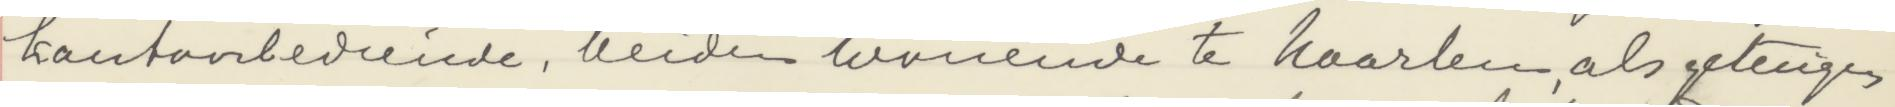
kantoorbediende, beiden wonende te Haarlem, als getuigen
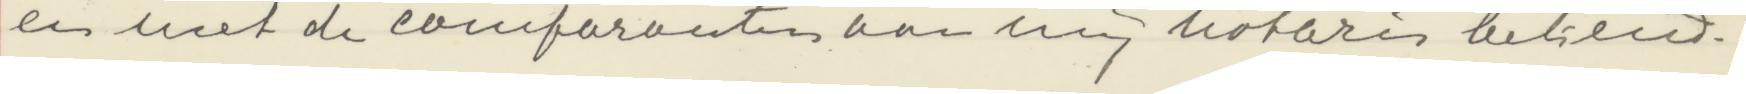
en met de comparanten aan mij notaris bekend.
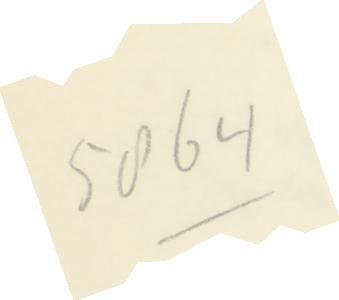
5864
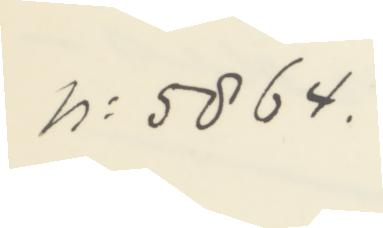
N: 5864.
